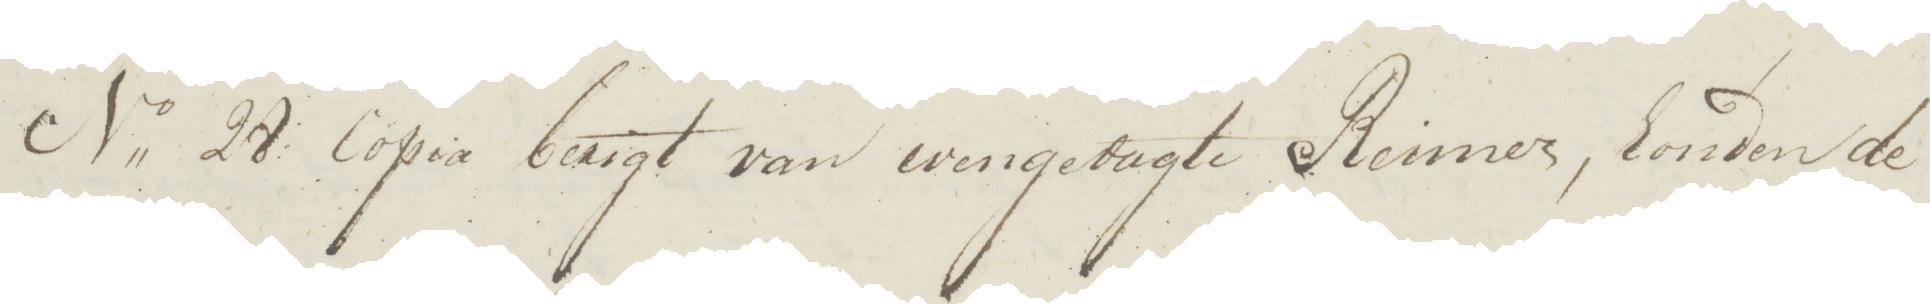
N„o 28: Copia berigt van evengedagte Reimer, houden de
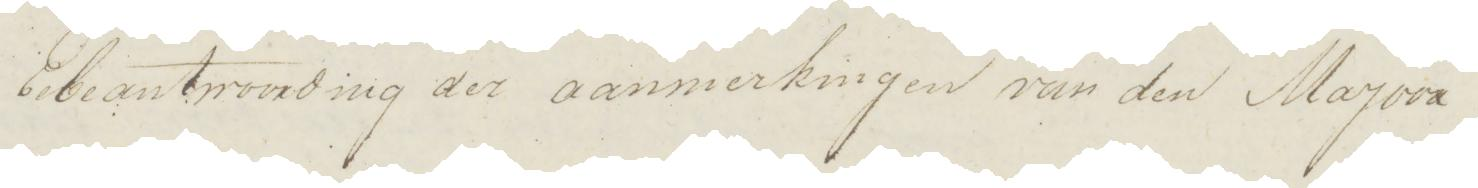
Eebeantwoording der aanmerkingen van den Majoor
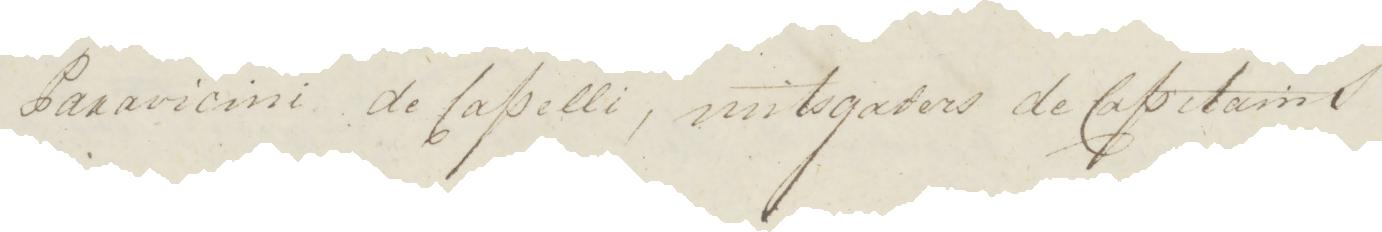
Paravicini de Capelli, mitsgaders de Capitains
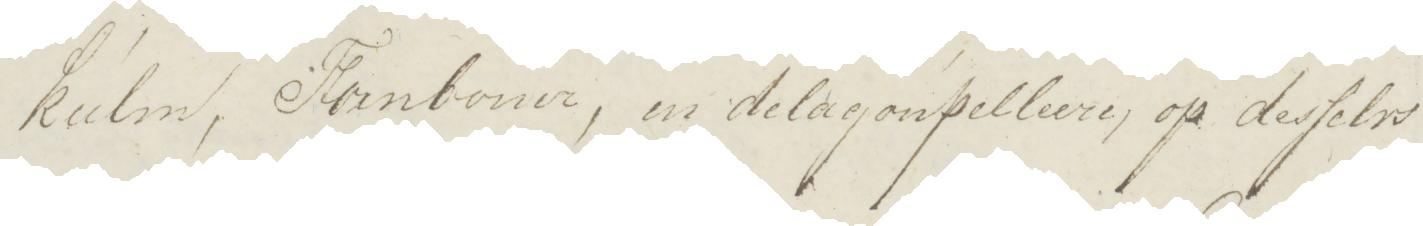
Kulm, Fornbouer, en delagoupelleere, op desselvs
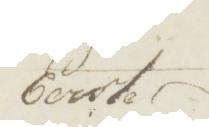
Eerste
